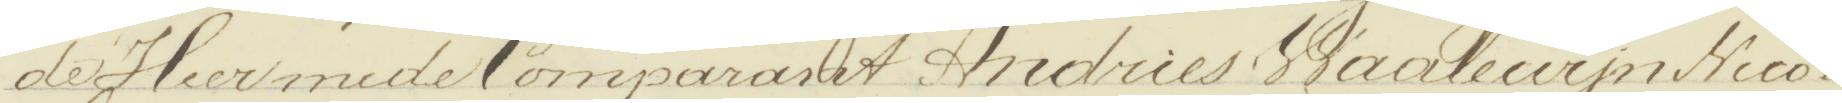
de Hiermede Comparant Andries Waalewijn Nico.
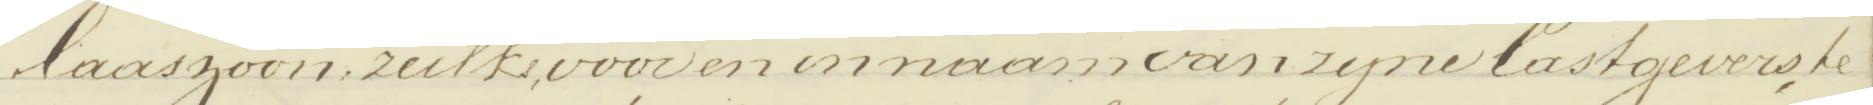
laaszoon, zulks voor en in naam van zyne lastgevers, te
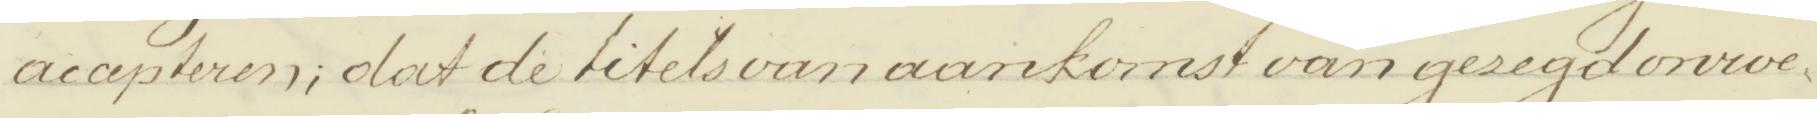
accepteren; dat de titels van aankomst van gezegd onroe„
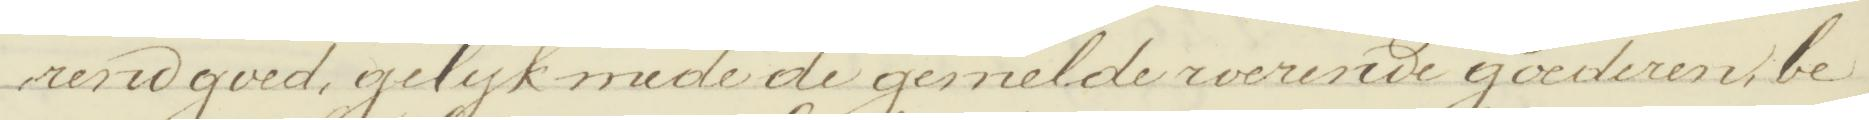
rend goed, gelyk mede de gemelde roerende goederen, be
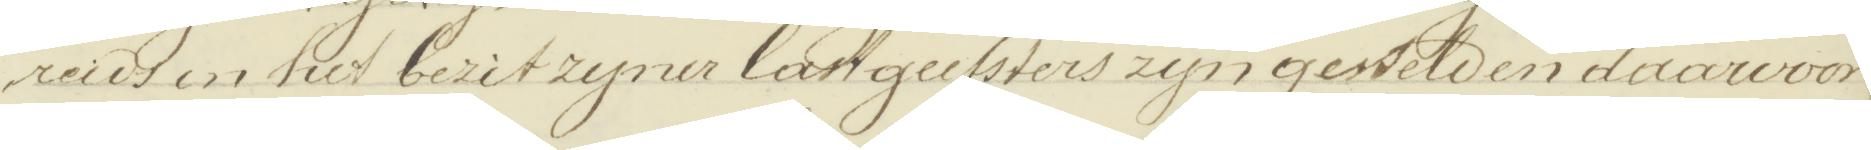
reids in het bezit zyner lastgeefsters zyn gesteld en daarvoor
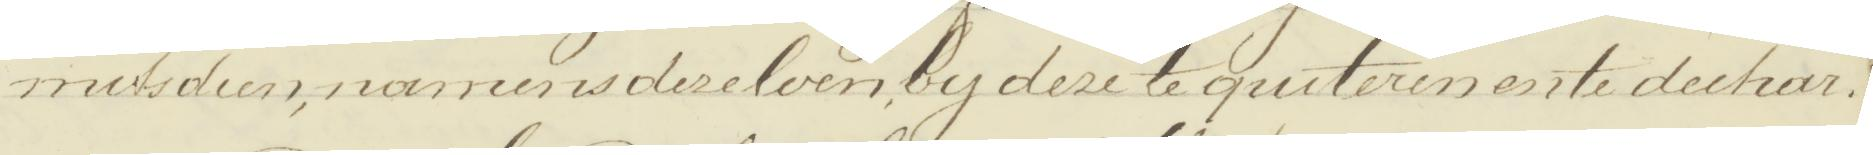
mitsdien, namens dezelven, by deze te quiteren en te dechar„
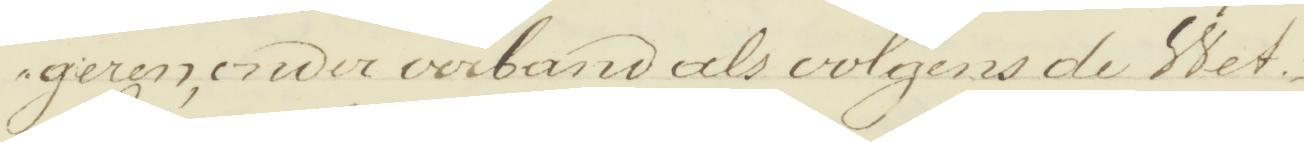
„geren, onder verband als volgens de Wet.
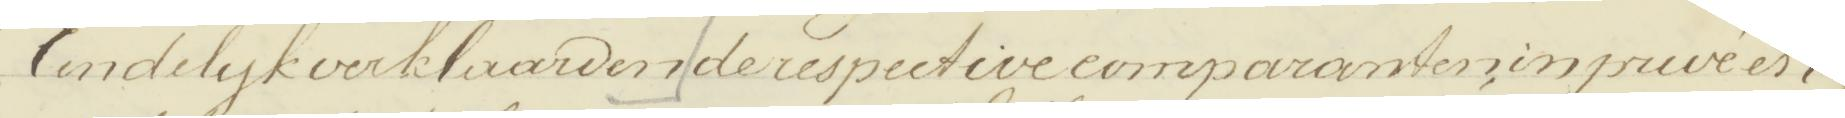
Eindelyk verklaarden/ de respective comparanten in privé en
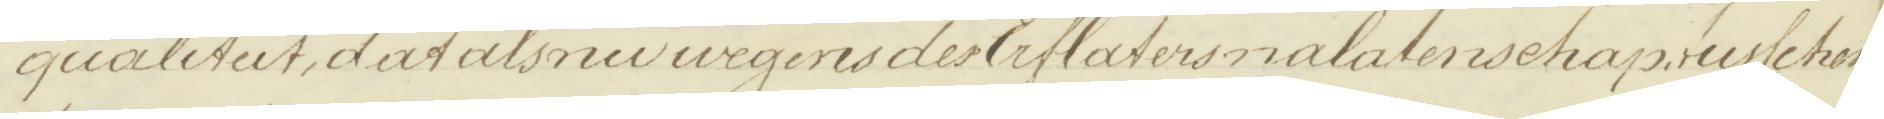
qualiteit, dat als nu wegens des Erflaters nalatenschap tusschen
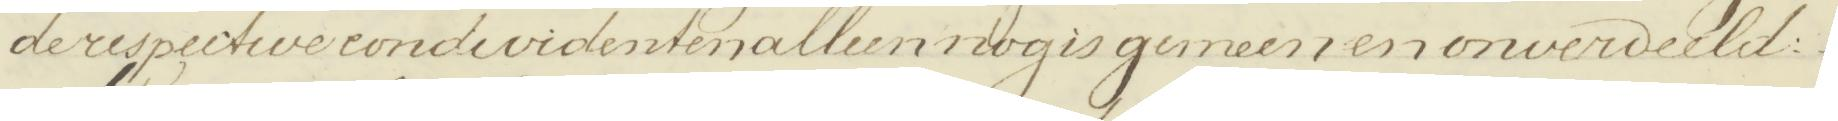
de respective condividenten alleen nog is gemeen en onverdeeld:
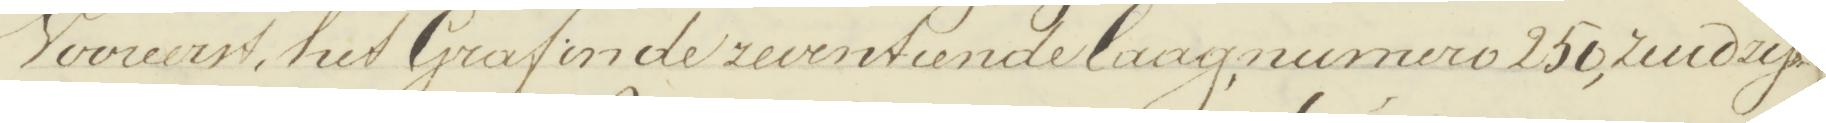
Vooreerst, het Graf in de zeventiende laag numero 250, zuid zy„
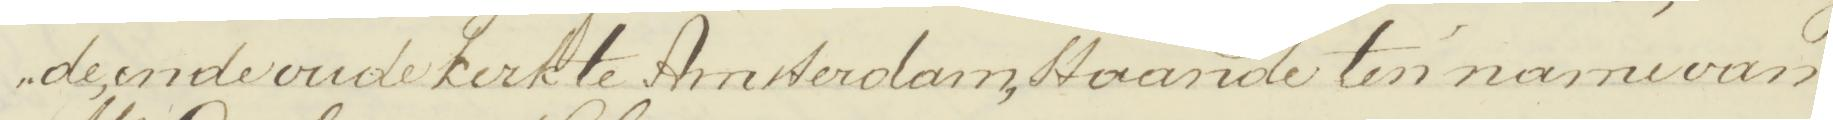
„de inde oude kerk te Amsterdam staande ten name van
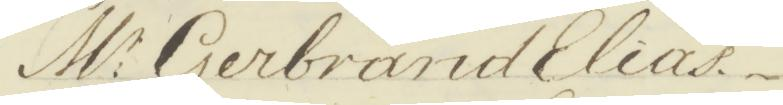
M:r Gerbrand Elias.—
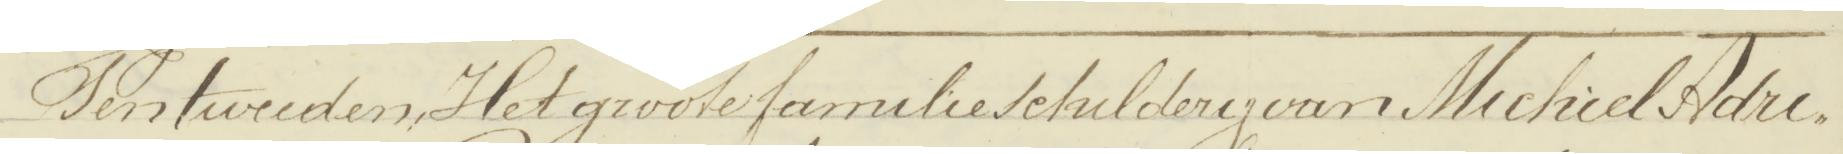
Ten tweeden, Het groote familieschildery van Michiel Adri.
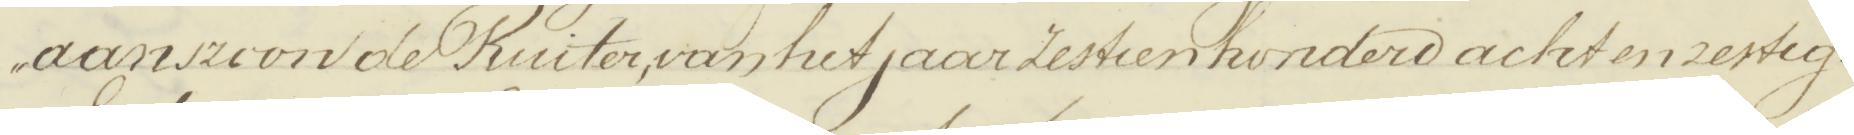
„aanszoon de Ruiter, van het jaar zestien honderd acht en zestig.
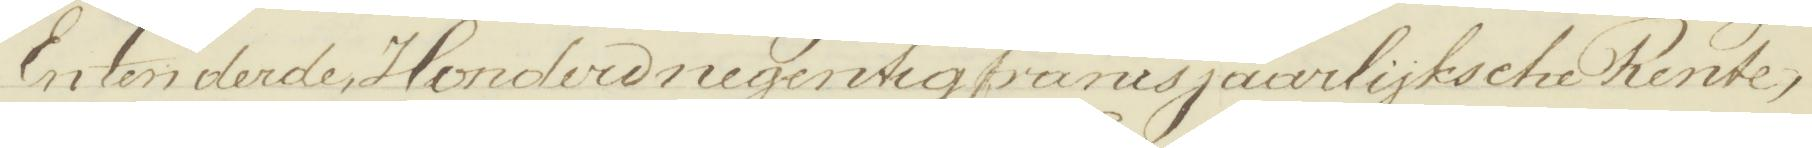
En ten derde, Honderd negentig francs jaarlijksche Rente,
